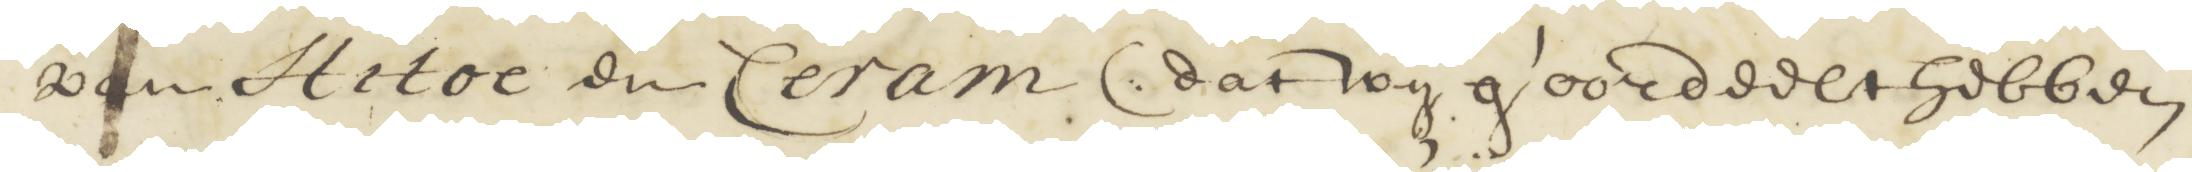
van Hitoe en Ceram (: dat wij g’oordeelt hebben
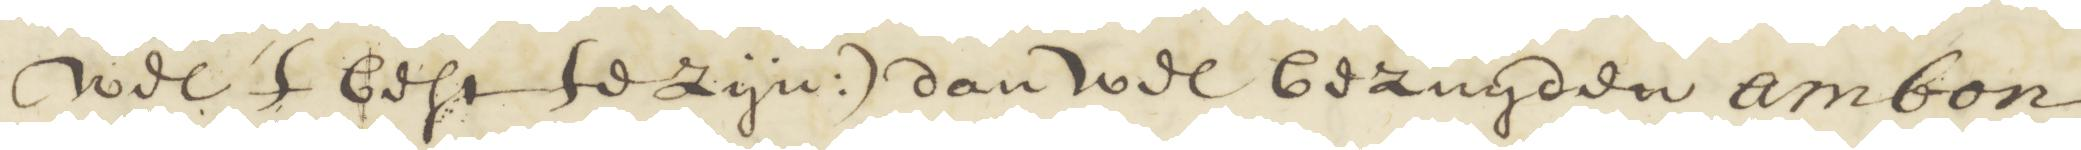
wel ’t best te zijn :) dan wel bezuijden ambon
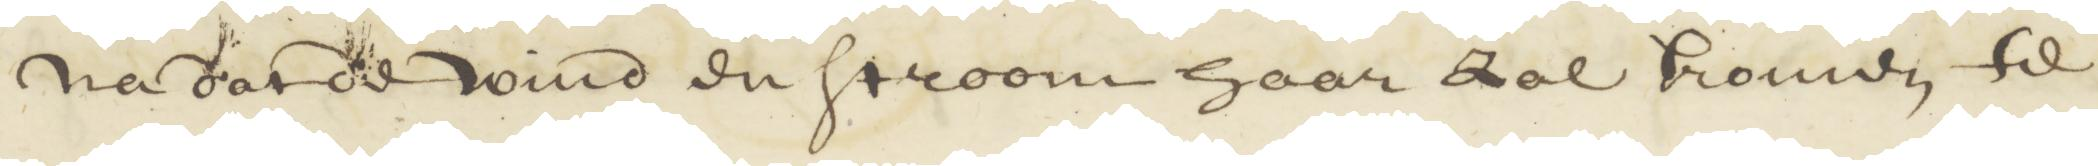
na dat de wind en stroom haar zal komen te
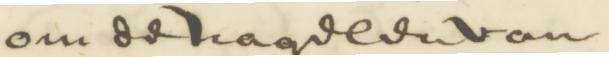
om de Nagelen van
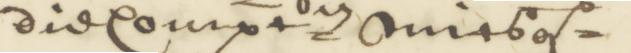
die Compt=en Mitsg=s
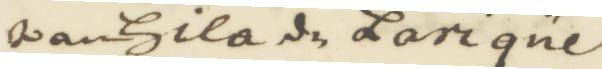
van Hila en Larique
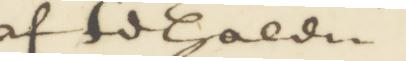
af te halen
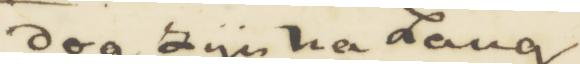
dog zijn na Lang
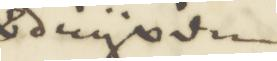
verdrijven
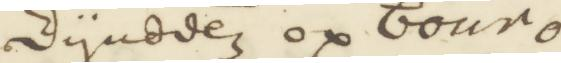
Eijndelijk op Bouro
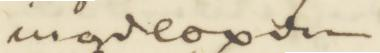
ingelopen
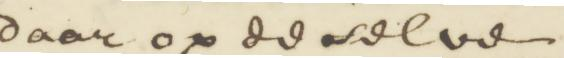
daar op de selve
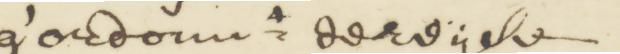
g’ordonn=t dereijse
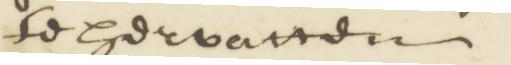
te hervatten
